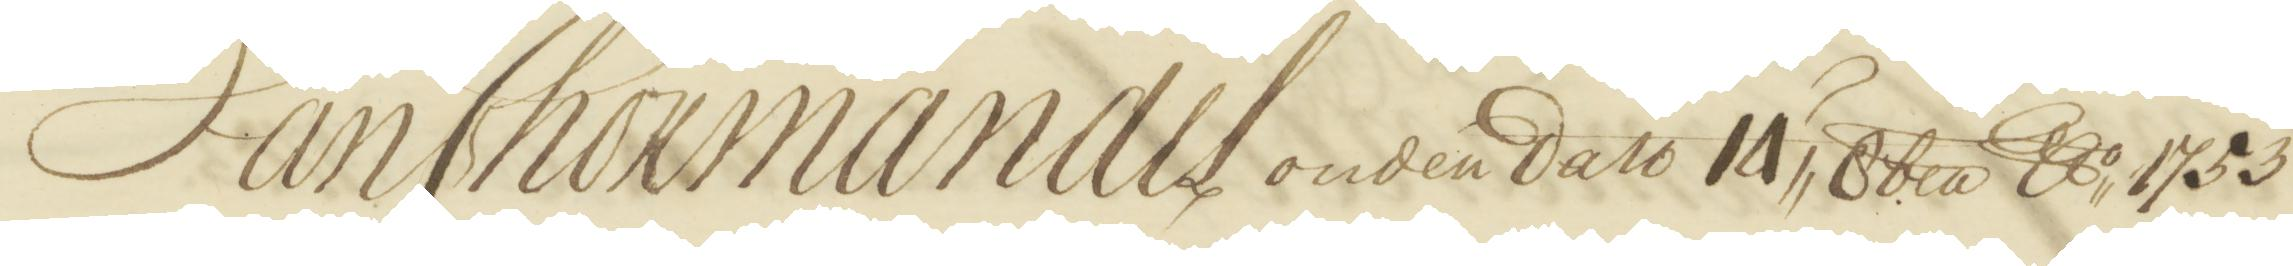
Van Chormandel onder dato 14„en 8ber A„o 1753
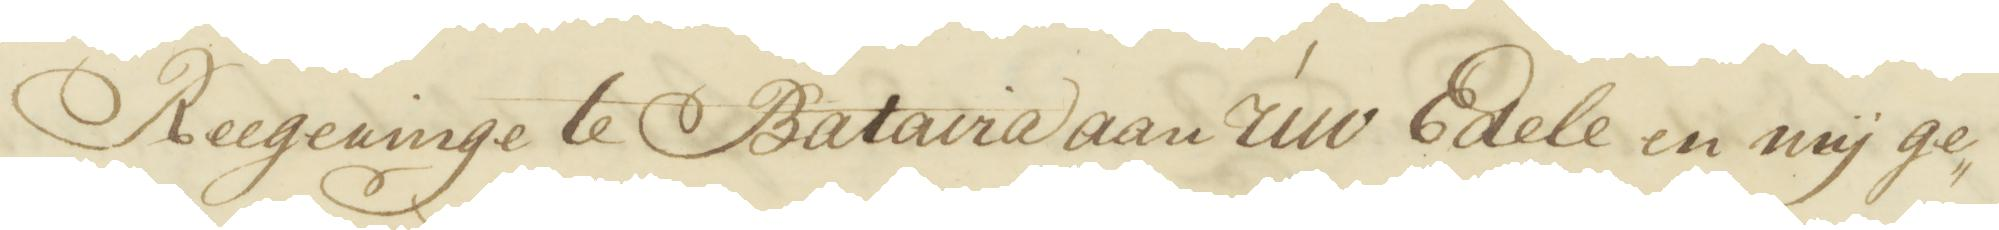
Reegeringe te Batavia aan uw Edele en mij ge„
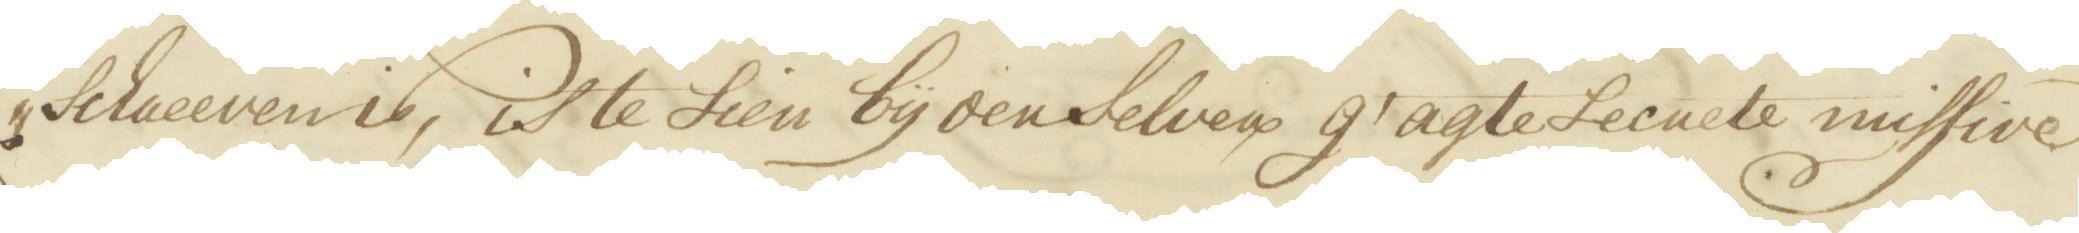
„Schreeven is, is te Sien bij der Selver g’agte Secrete missive
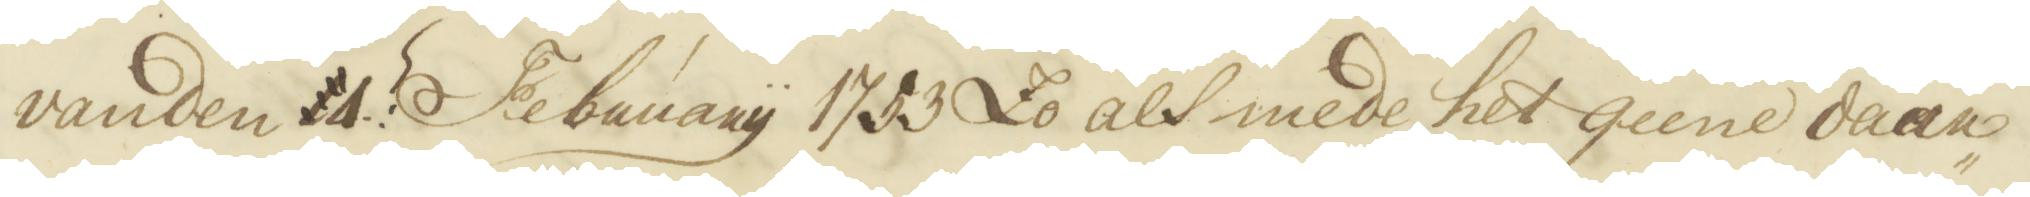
van den 14:' Februarij 1753 Zo als mede het geene daar„
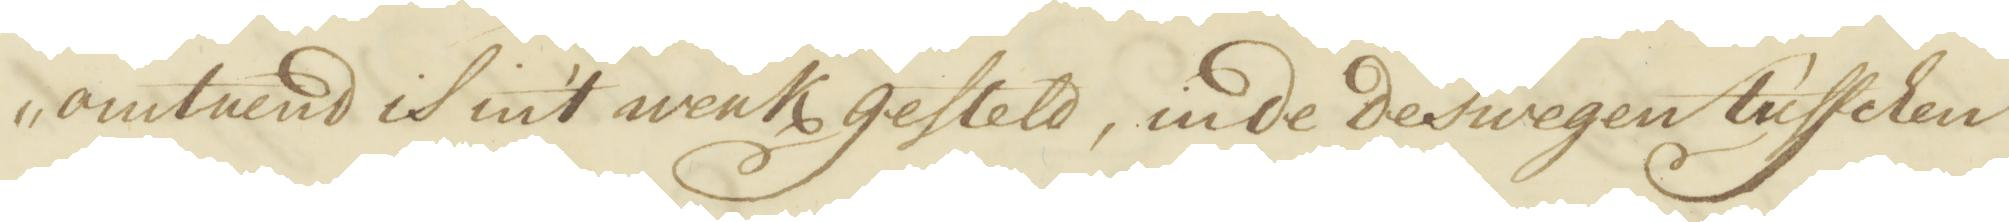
„omtrend is in’t werk gesteld, inde deswegen tusschen
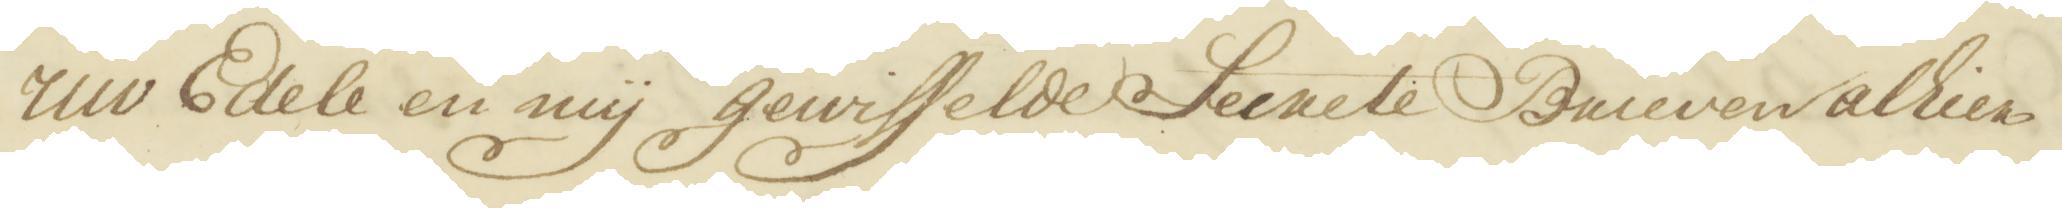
uw Edele en mij gewisselde Secrete Brieven alhier
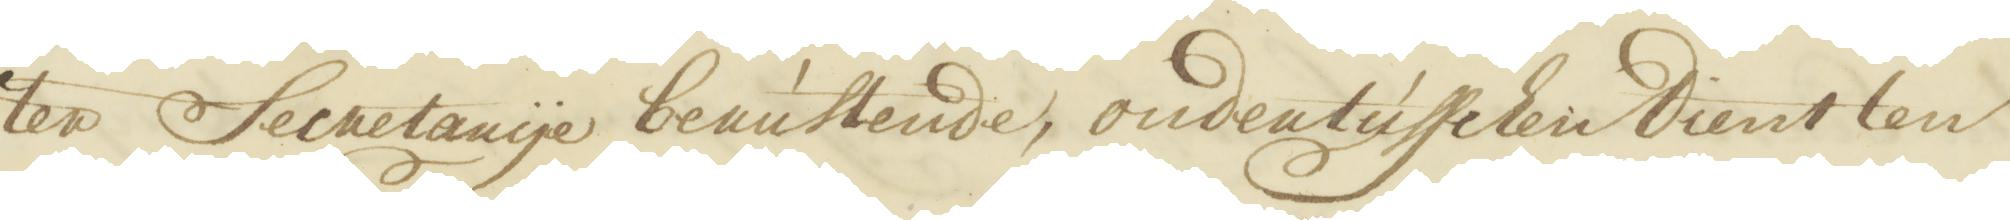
ter Secretarije berustende, ondertusschen dient ten
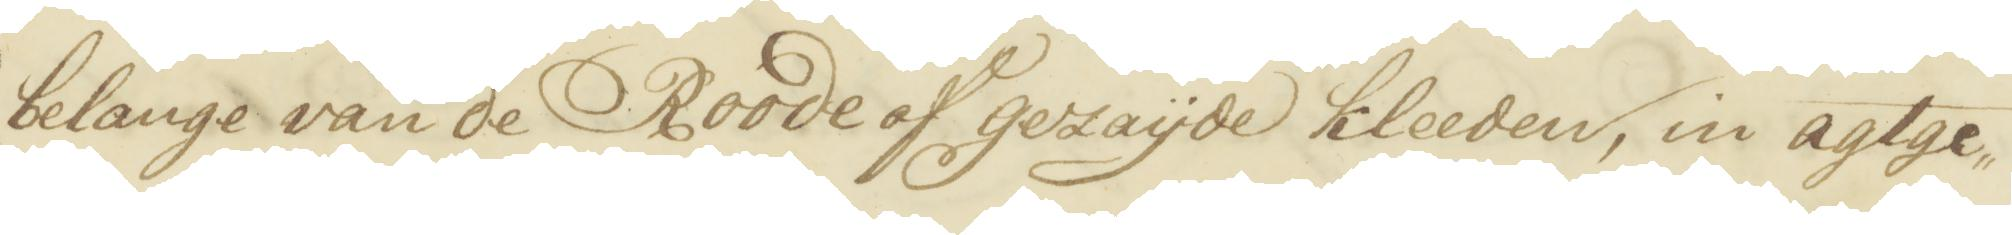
belange van de Roode of gezaijde kleeden, in agtge„
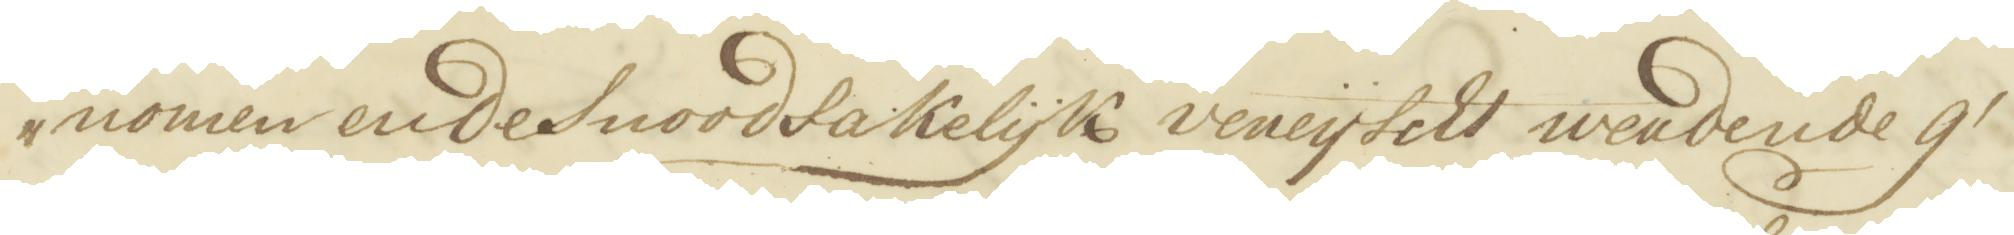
„nomen en desnoodsakelijk vereijscht werdende g’
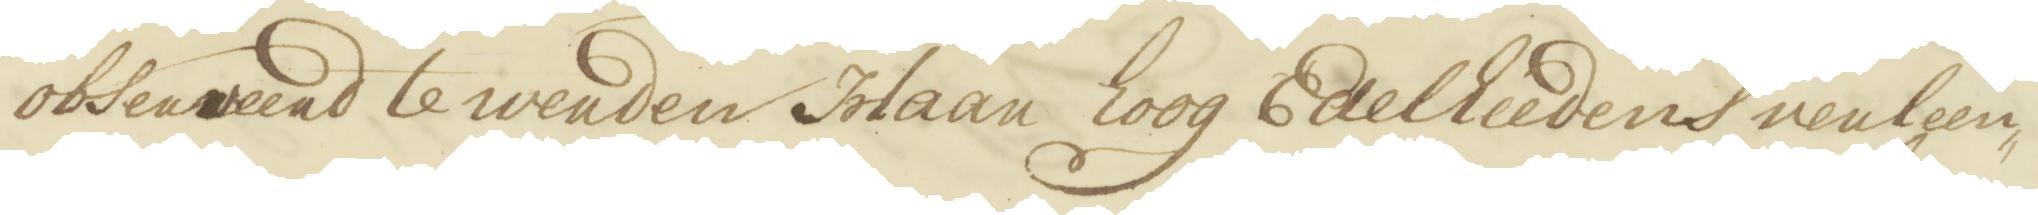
observeerd te werden Haar hoog Edelheedens verleen„
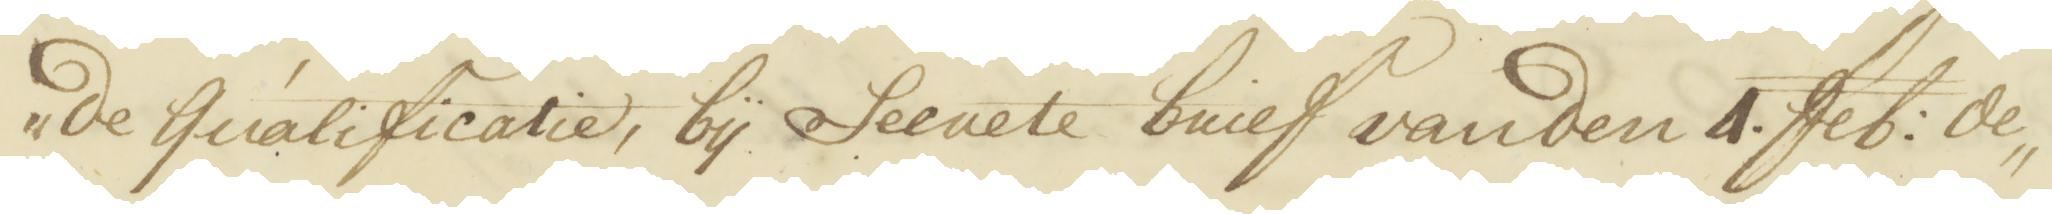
„de Qualificatie, bij Secrete brief van den 4. feb: de„
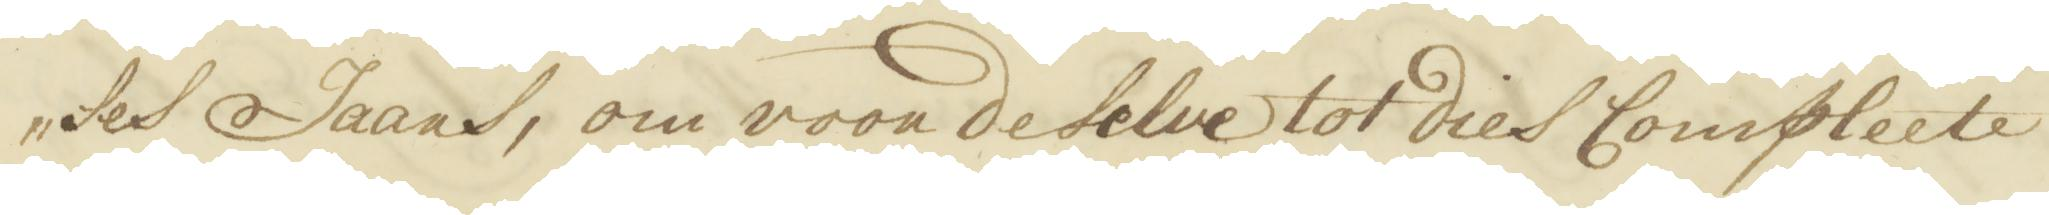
„ses Iaars, om voor deselve tot dies Compleete
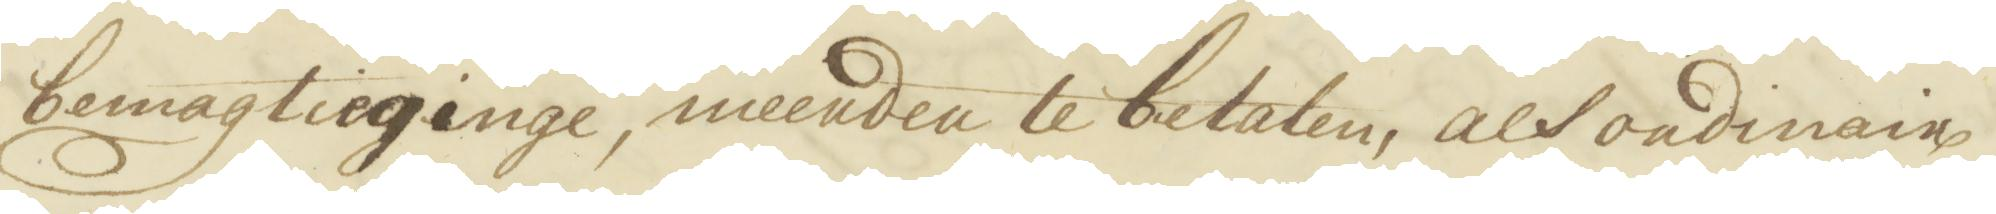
bemagtieginge, meerder te betalen, als ordinair
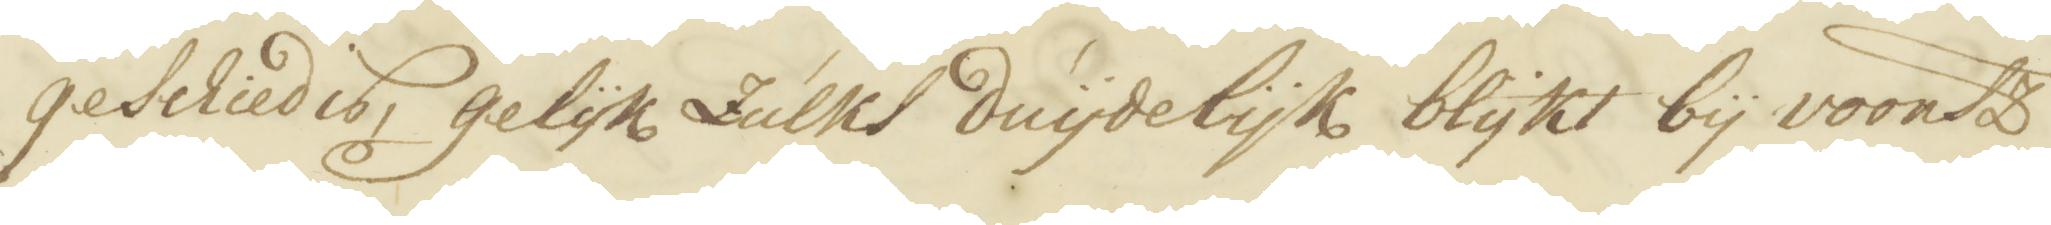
geschied is, gelijk Zulks duijdelijk blijkt bij voorsz
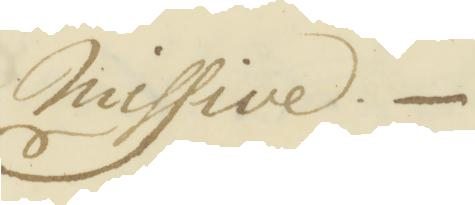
missive. —
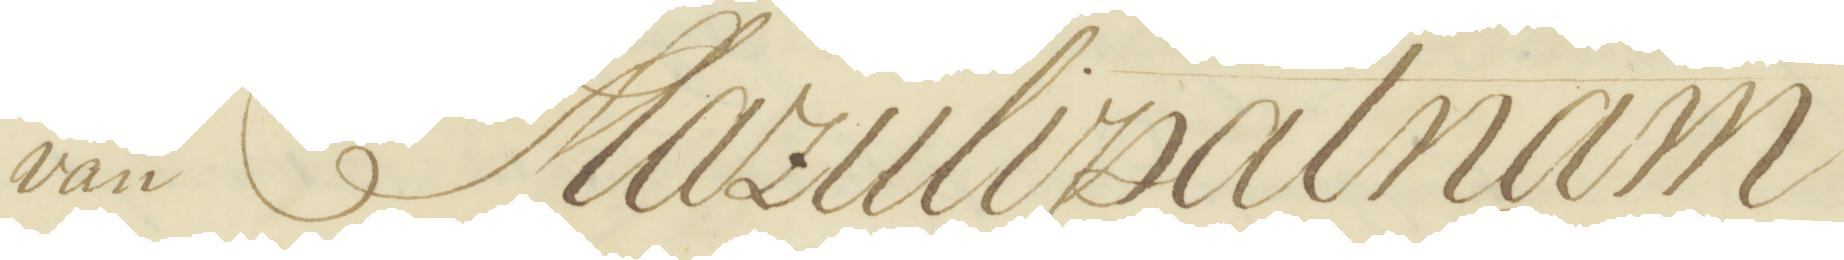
van Mazulipatnam
